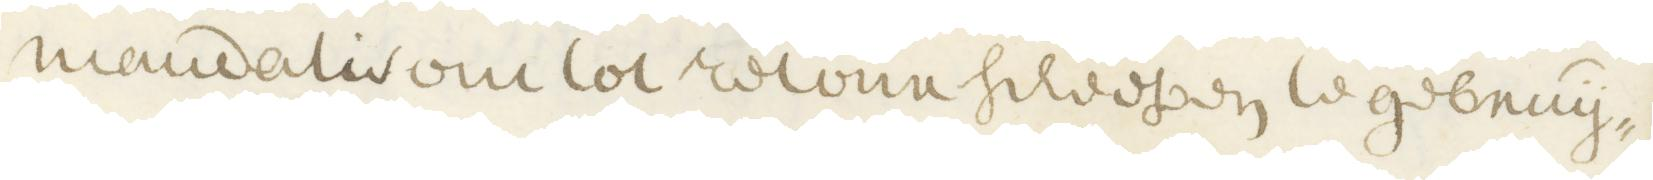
mandatie om tot retour scheepen te gebruij„
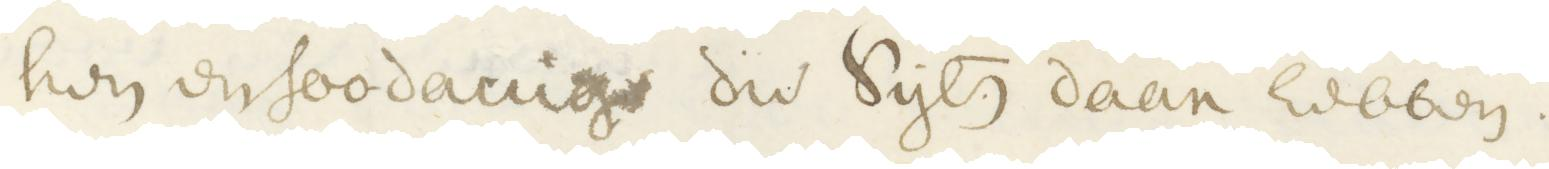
ken en soodanig die sijllijk daar hebben.
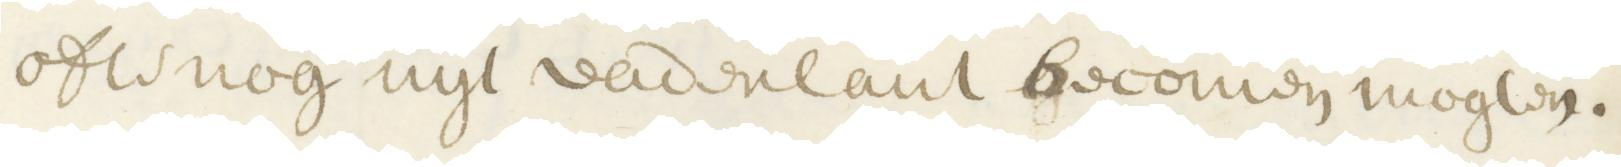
ofte nog uijt vaderlant becomen mogten.
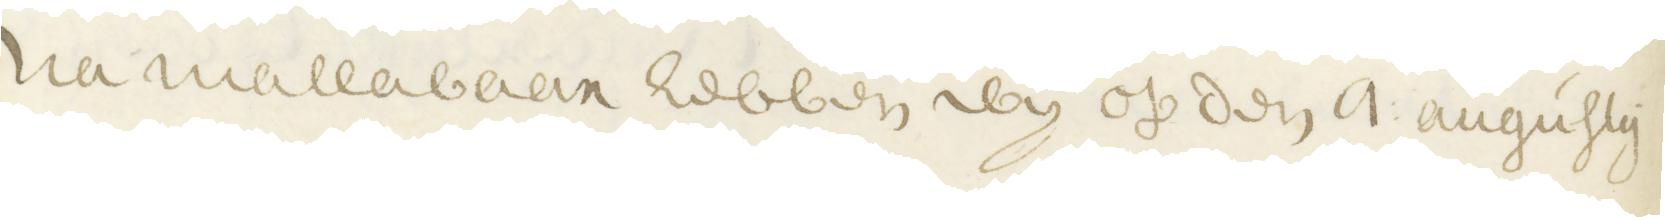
na mallabaar hebben wij op den 4: augustij
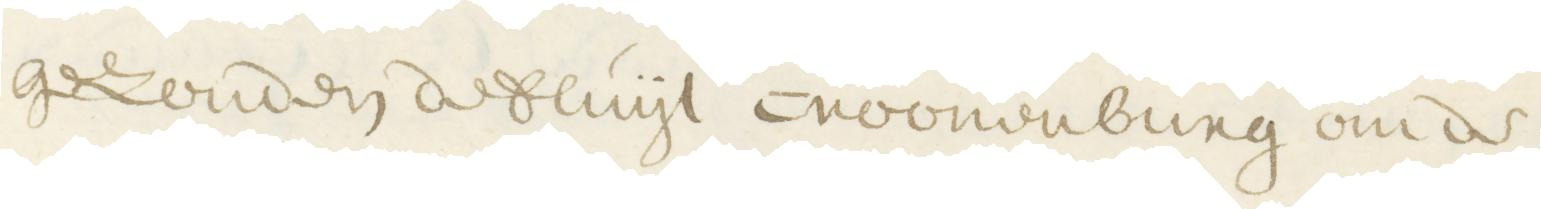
gezonden de fluijt croonenburg om de
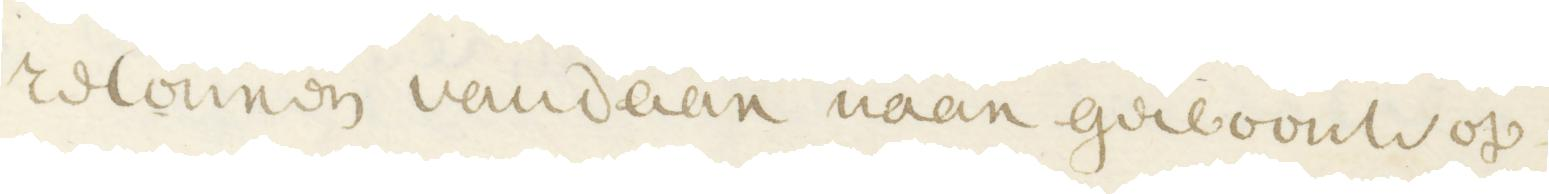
retouren vandaar naar gewoonte op
